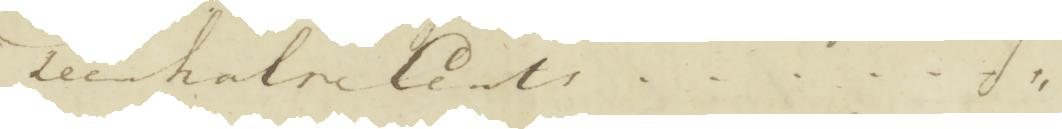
& een halve Cents. . . . . . „
